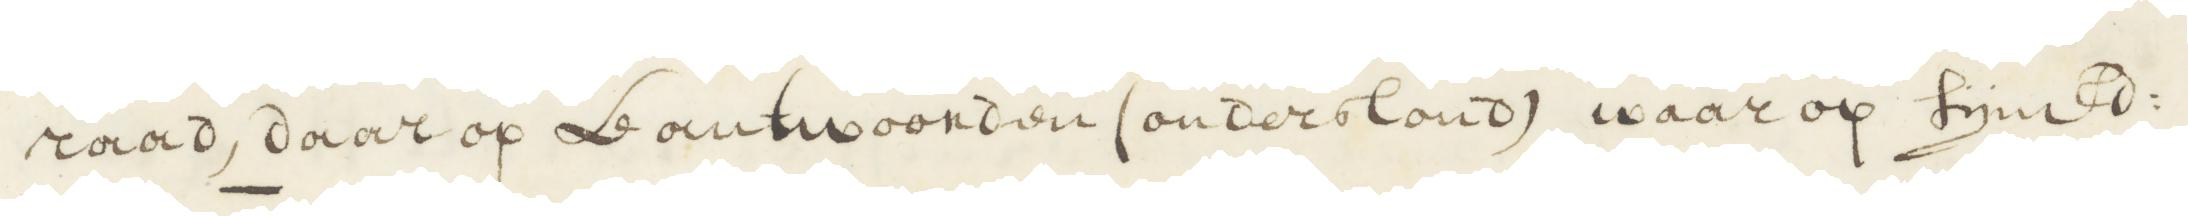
raad, daar op te antwoorden (onderstond) waar op sijn Ed:
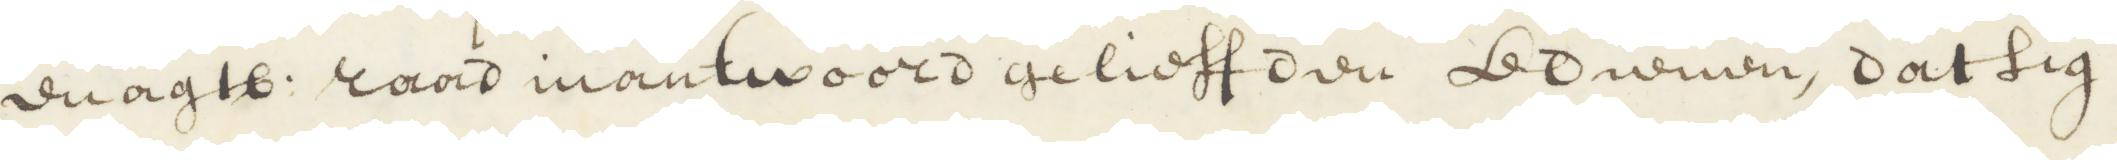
en agtb: raad in antwoord gelieffden te dienen, dat sig
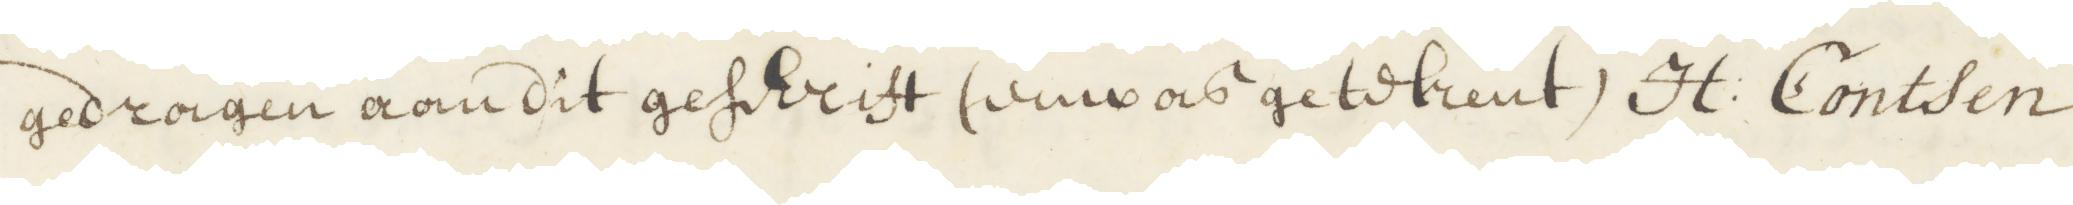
gedragen aan dit geschrift (en was getekent) H: Contsen
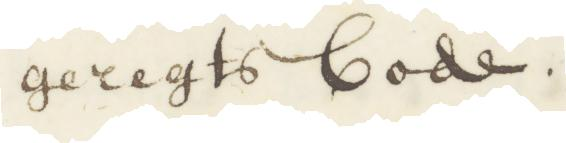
geregts bode
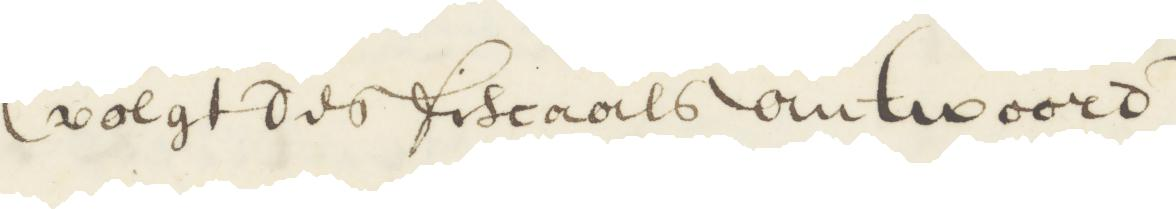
volgt des fiscaals antwoord
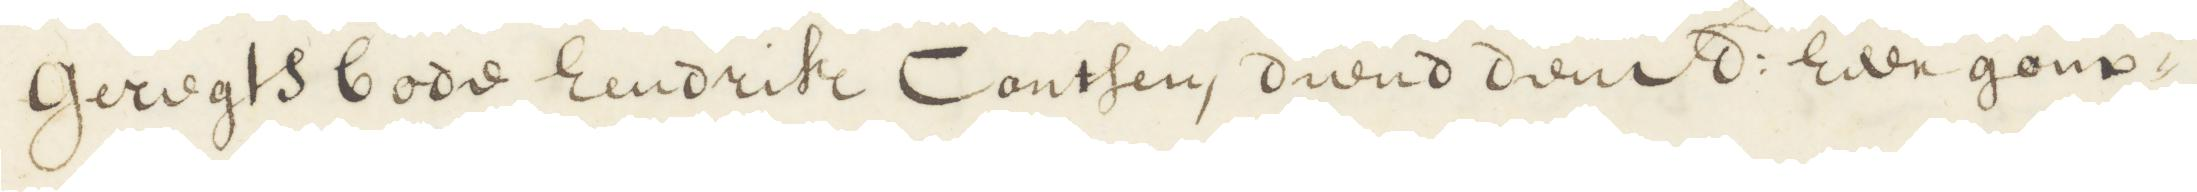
Geregts bode hendrik Contsen, diend den Ed: heer gouv„
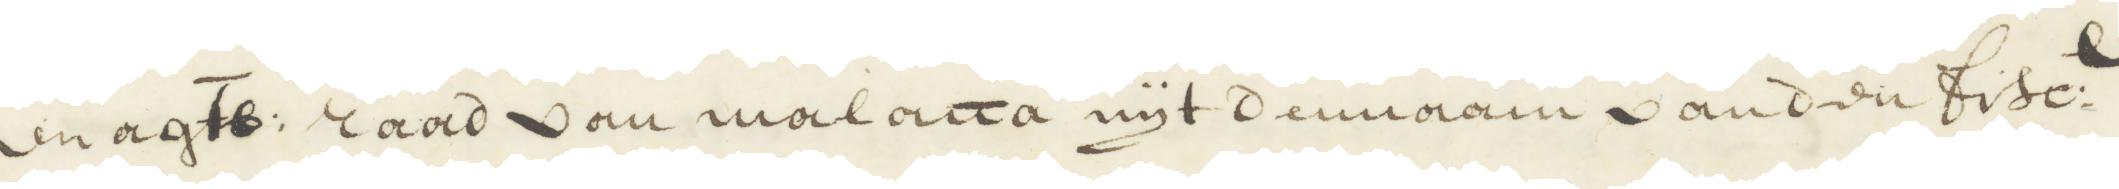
en agtb: raad van malacca uijt den naam van den fisc:l
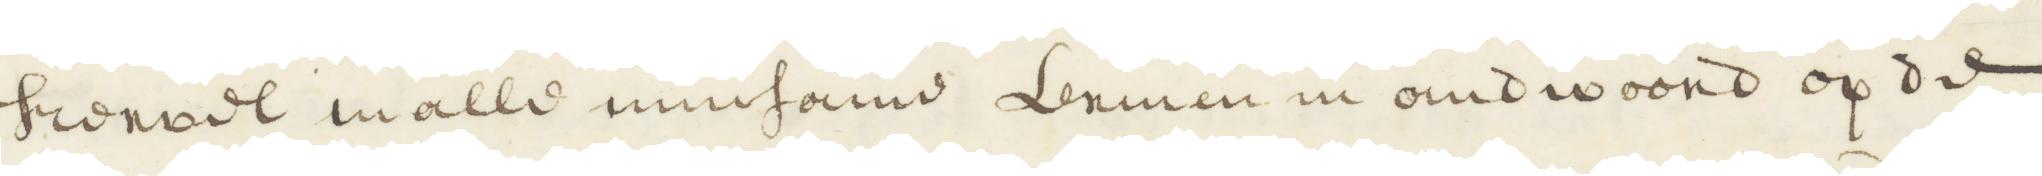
kervel in alle minsame termen in andwoord op de
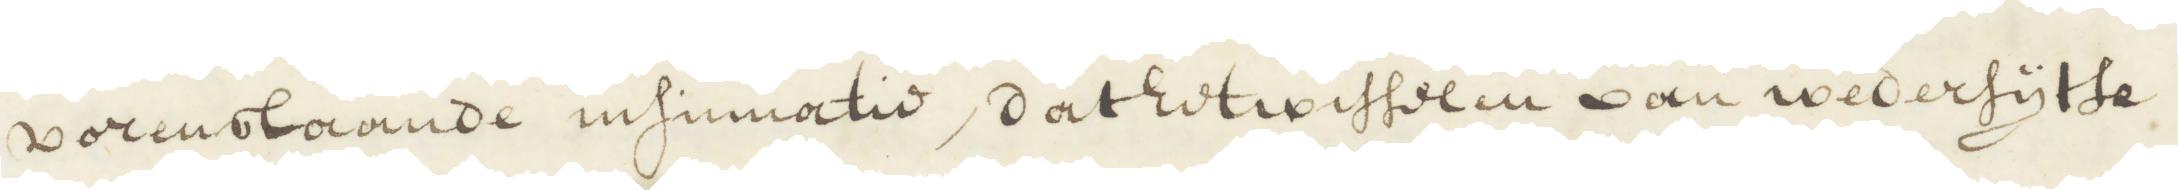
vorenstaande insinuatie, dat het wisselen van wedersijtse
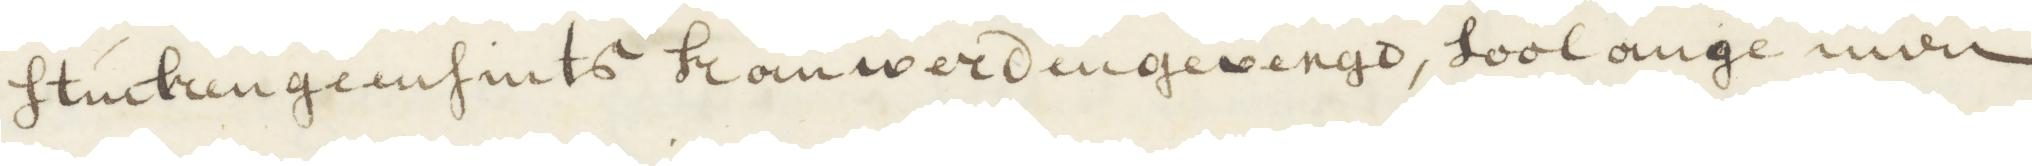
stucken geensints kan werden gevergd, soolange men
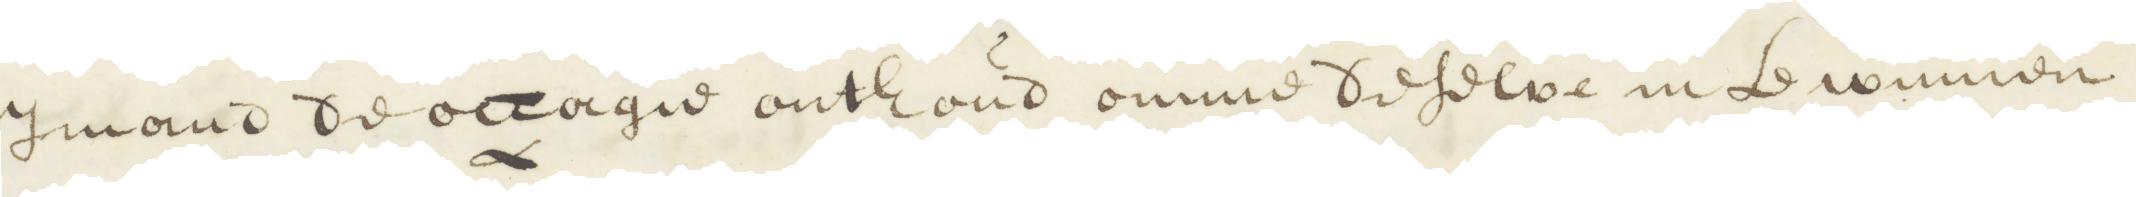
Jmand de occagie onthoud omme deselve in te winnen
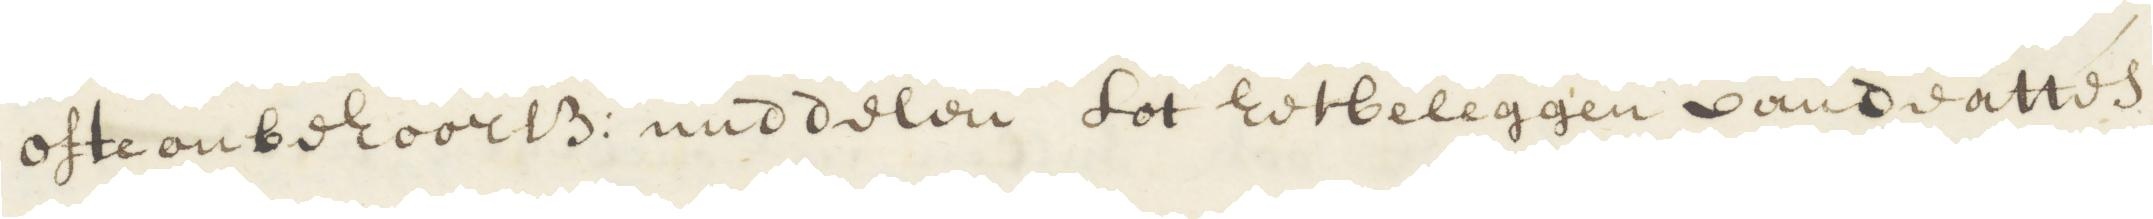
ofte onbehoorlijk: middelen tot het beleggen van de attes
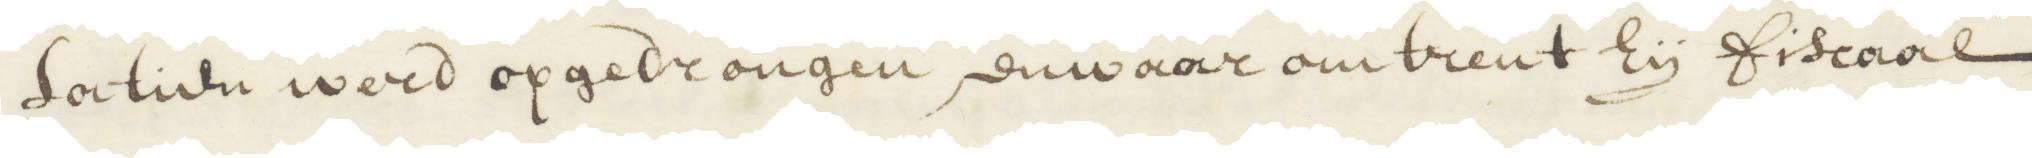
tatien werd opgedrongen, en waar om trent hij fiscaal
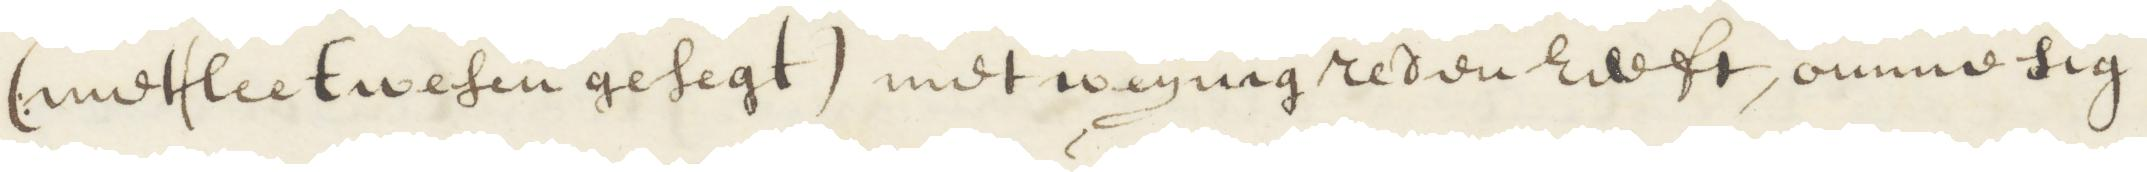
: met (leetwesen gesegt) met weijnig reden heeft, omme sig
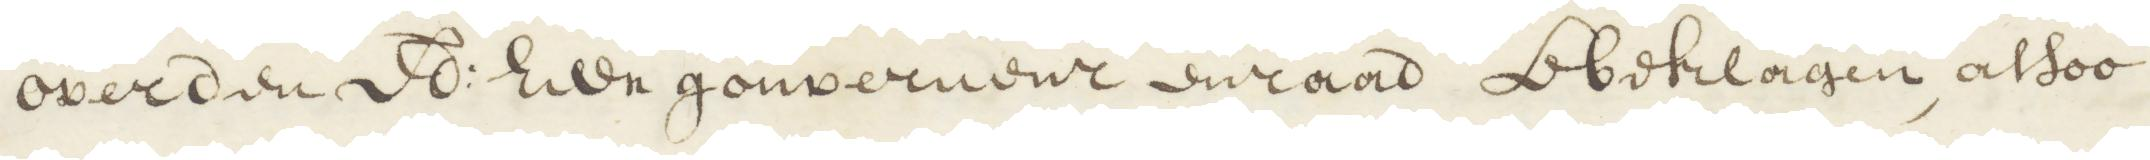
over den Ed: heer gouverneur en raad te beklagen, alsoo
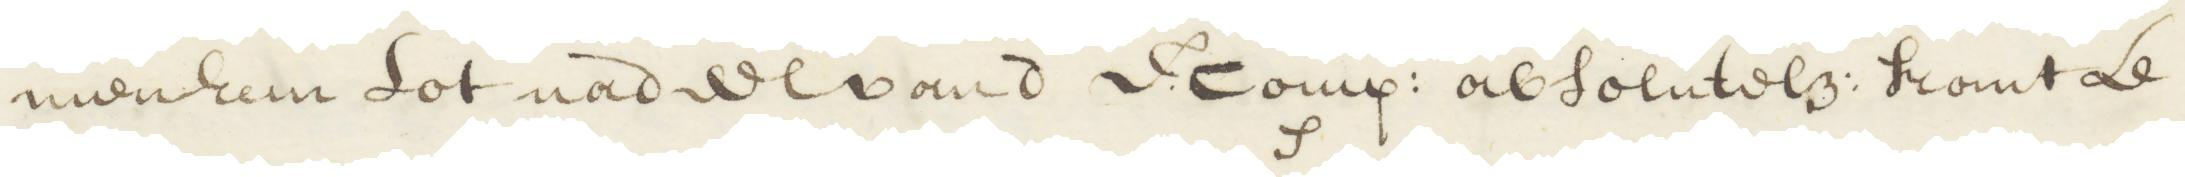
men hem tot nadeel vand' E: Comp: absolutelijk: komt te
